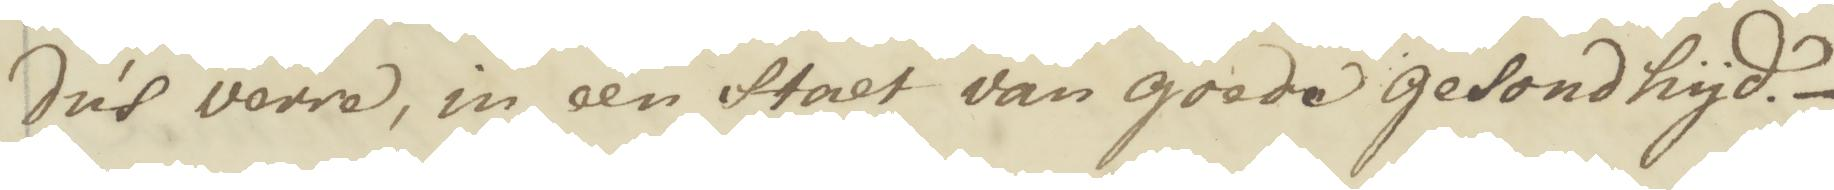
dus verre, in een staet van goede gesondhijd. —
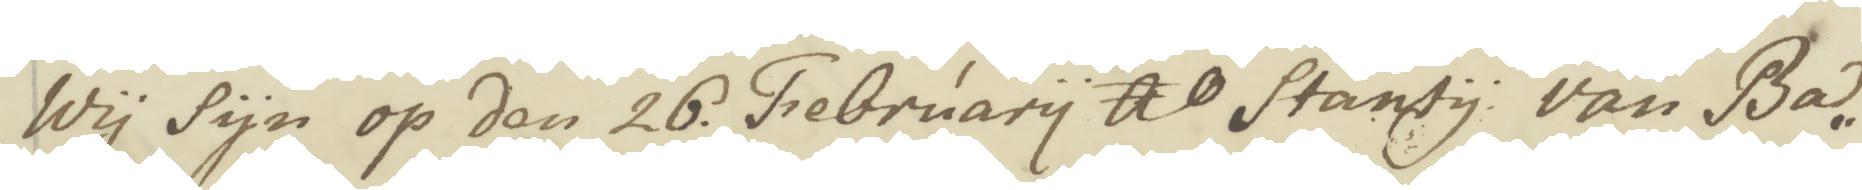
wij sijn op den 26. Februarij Ao stantij: van Ba„
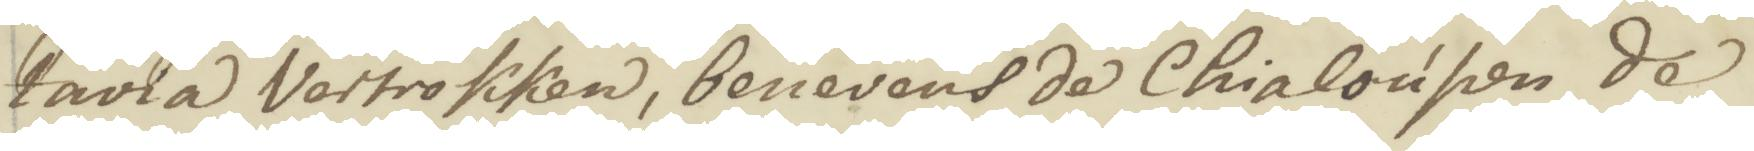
tavia vertrokken, benevens de Chialoupen de
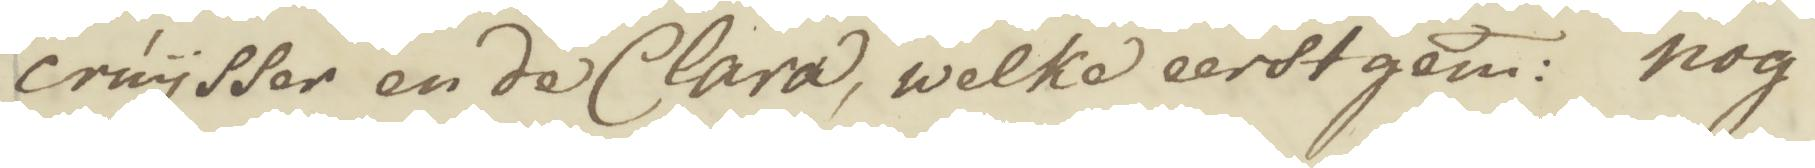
cruijsser en de Clara, welke eerstgem: nog
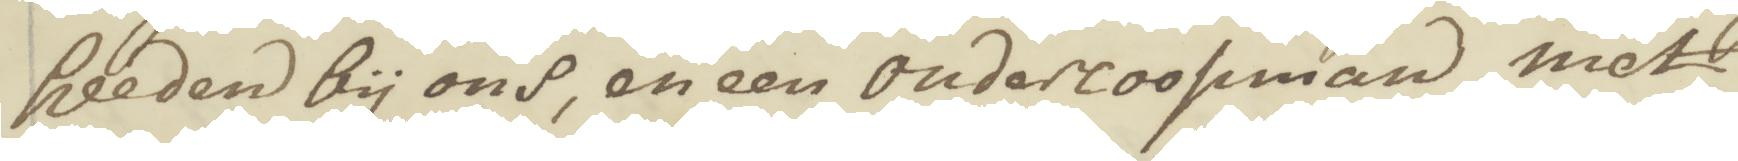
heeden bij ons, en een ondercoopman met
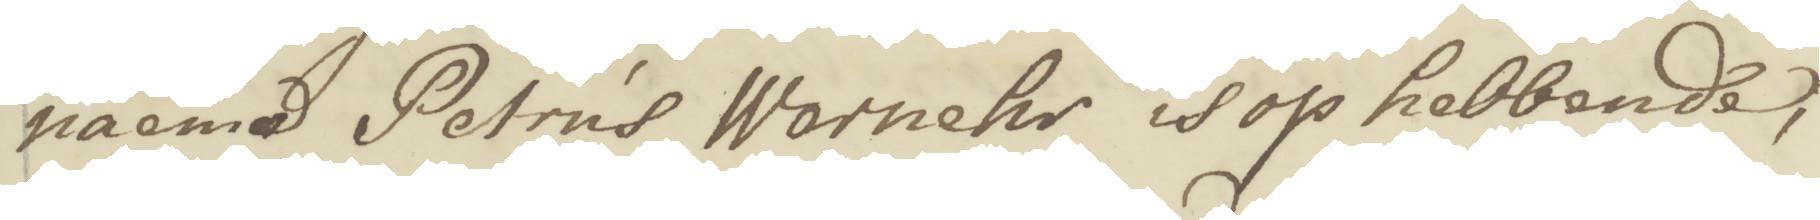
naeme Petrus Wornehr is op hebbende,
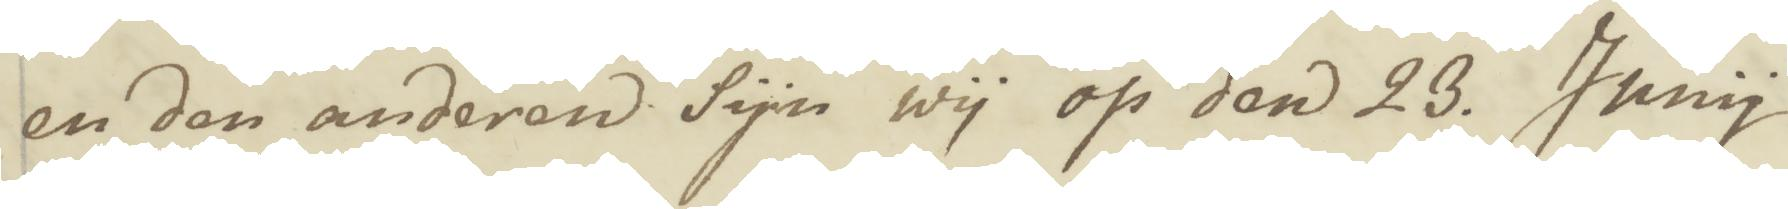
en den anderen sijn wij op den 23. Junij
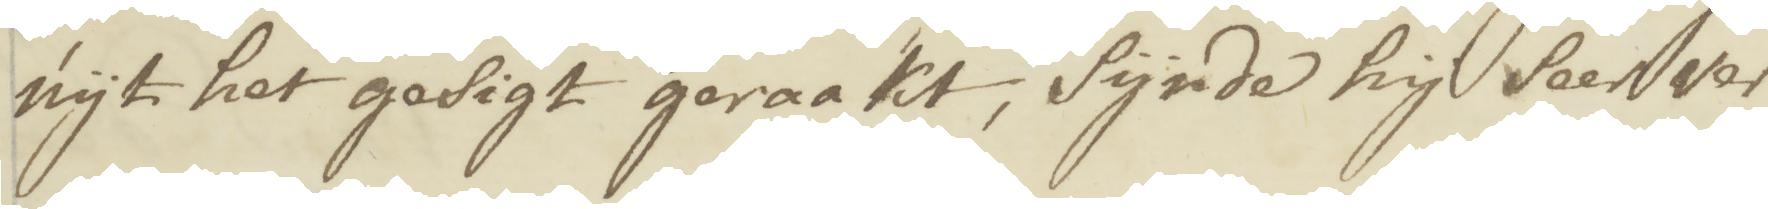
uijt het gesigt geraakt, sijnde hij seer ver
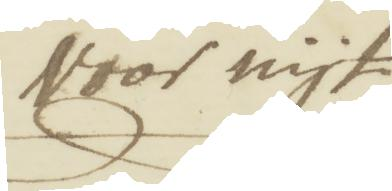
voor uijt
